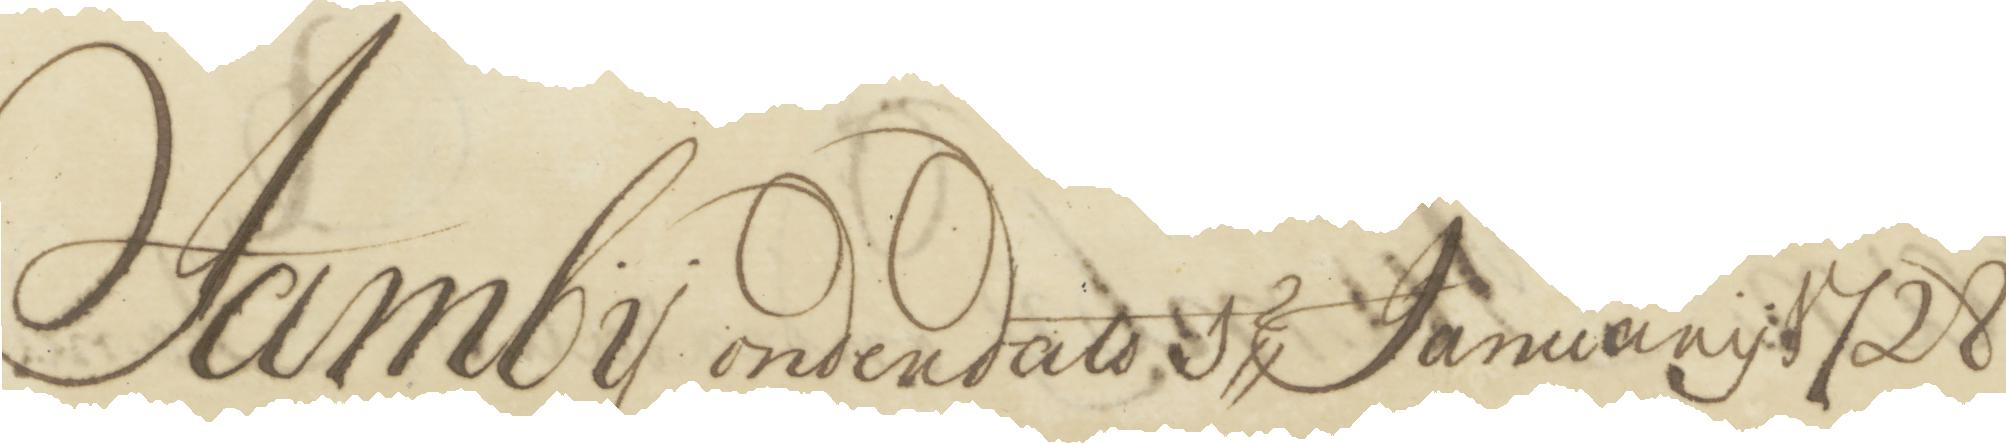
Jambij onder dato 1„' Januarij 1728
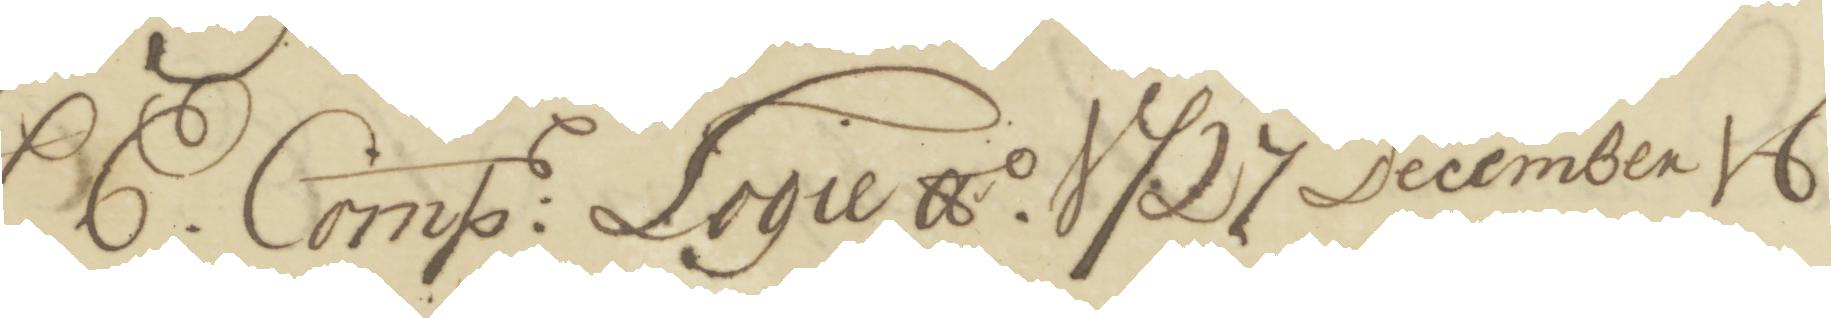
S E: Comp:s Logie a.o 1727 December 16
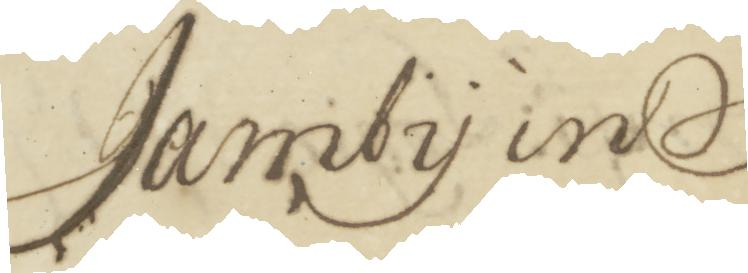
Jambij in
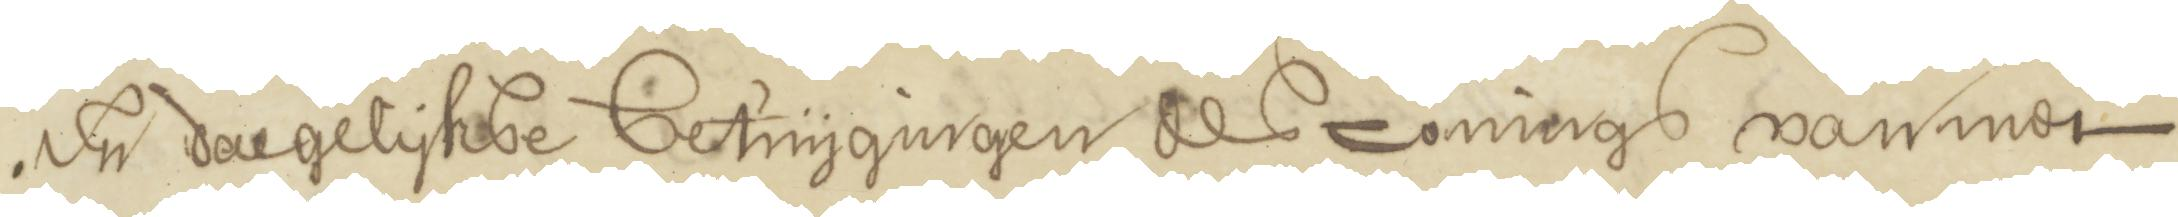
En daegelijkse betuijgingen des conings van met
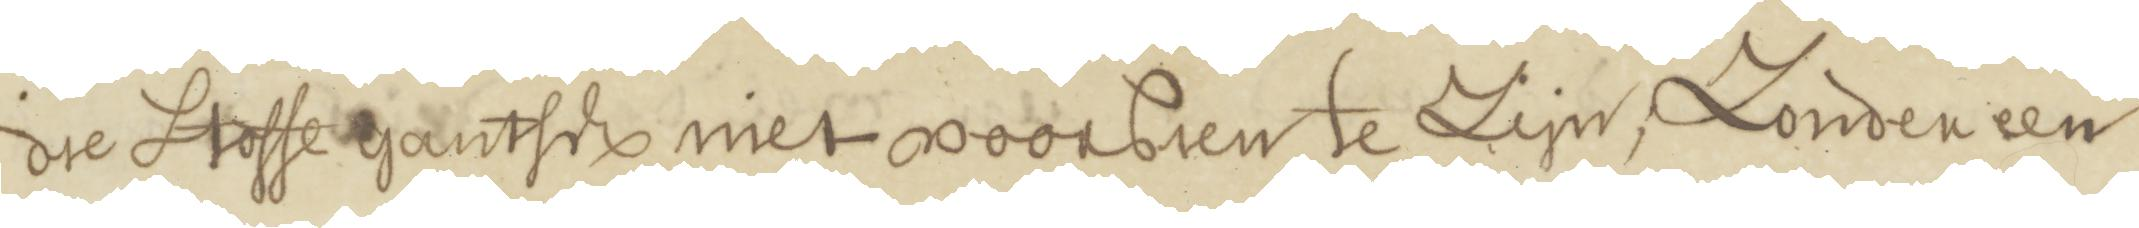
die stoffe gantsch niet voorsien te zijn, zonder een
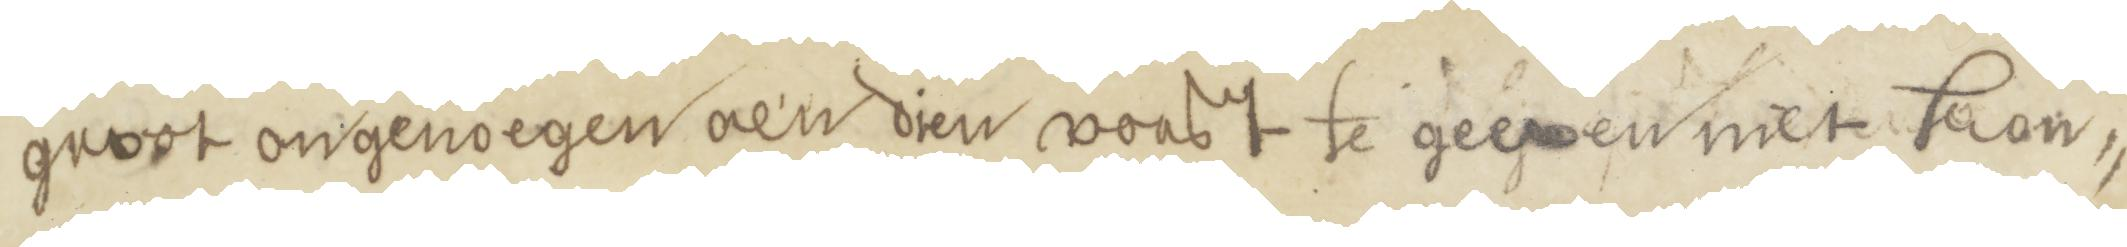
groot ongenoegen aen dien vorst te geeven niet kon„
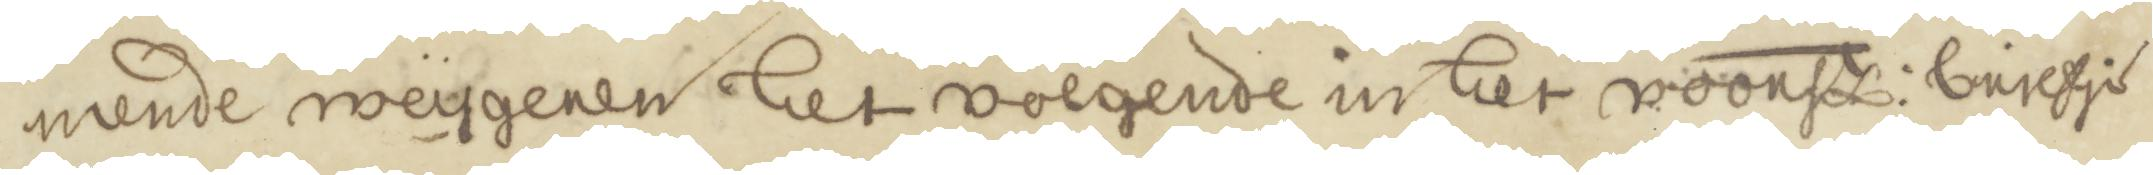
nende weijgeren het volgende in het voorsz: brjefje
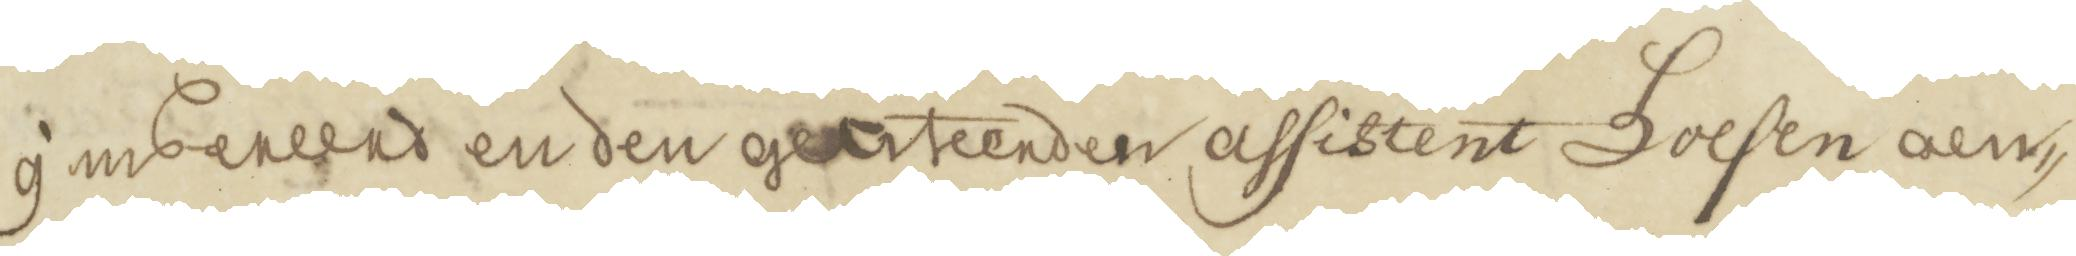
g'mbereerd en den geciteerden assistent Hoesen aen„
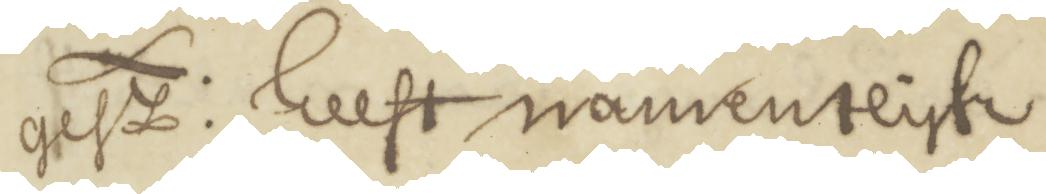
gesz: heeft namentlijk
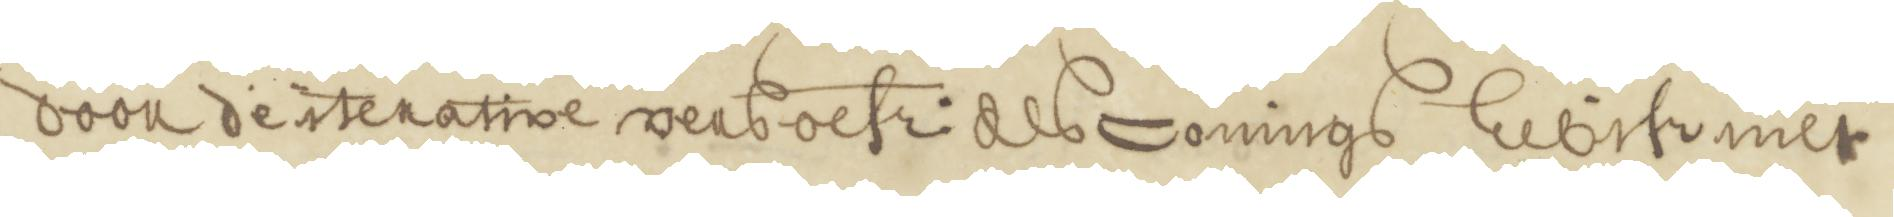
door de iterative versoek: des conings heb ik niet
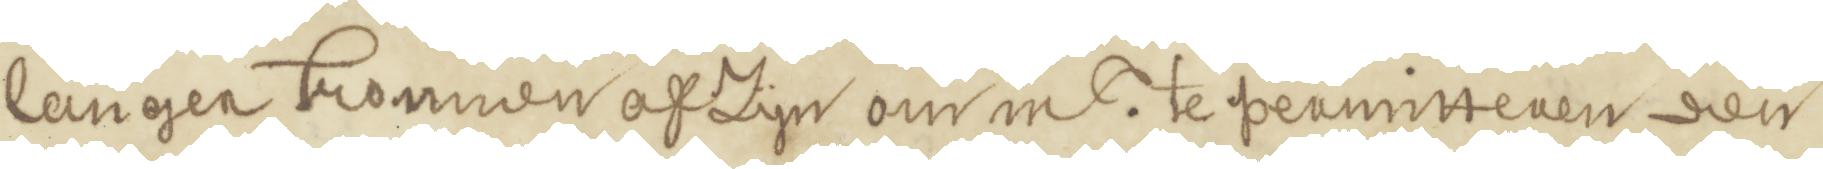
langer konnen af zijn om uE. te permitteren een
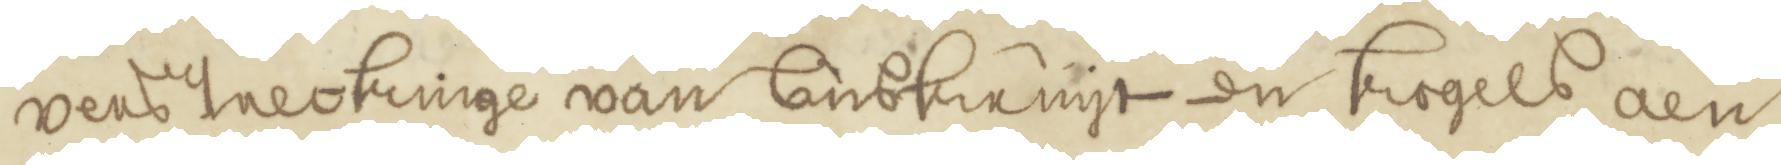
verstreckinge van buskruijt en kogels aen
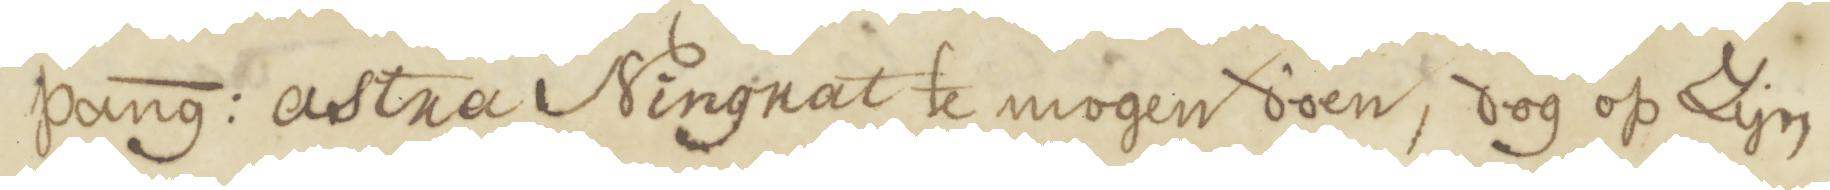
pang: astra Ningrat te mogen doen, dog op zijn
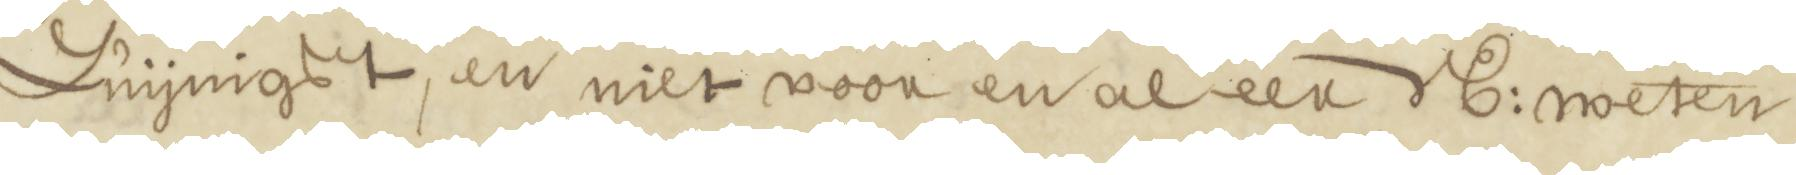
zuijnigst, en niet voor en al eer VE: weten
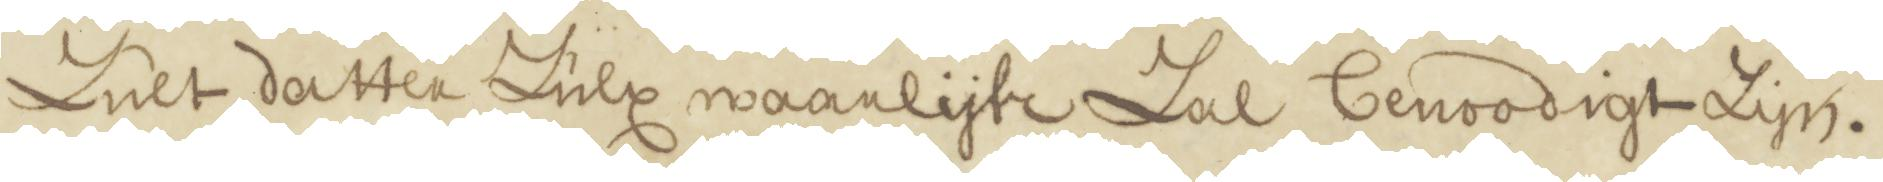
zult datter zulx waarlijk zal benoodigt zijn.
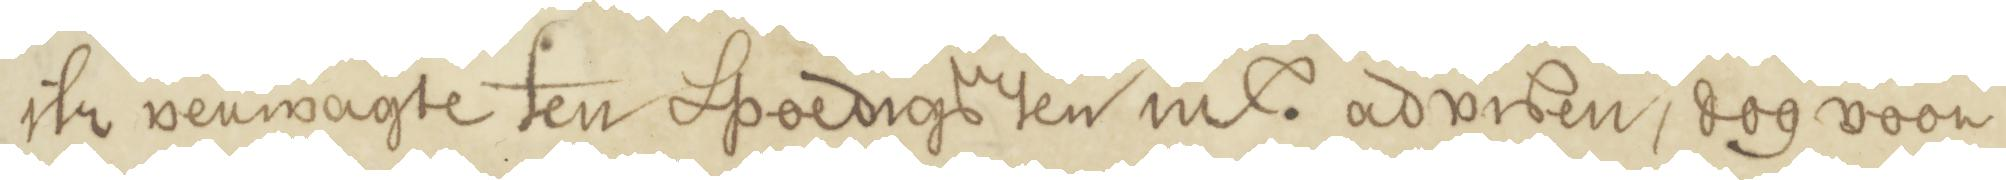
ik verwagte ten spoedigsten uE. advisen, dog voor
